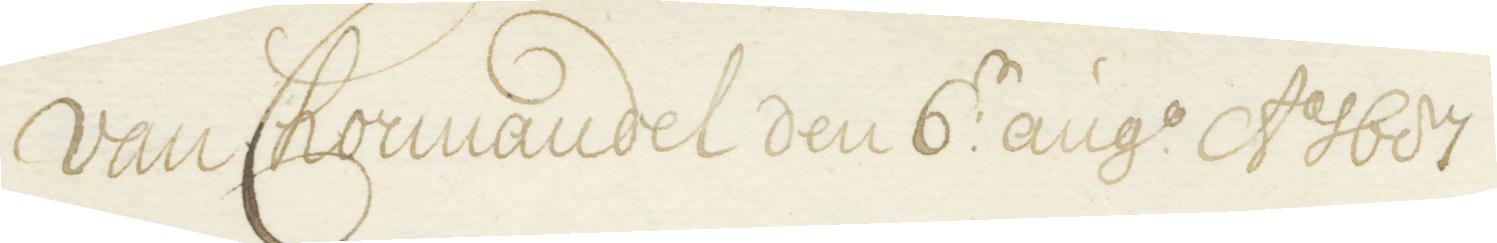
van Chormandel den 6:n aug:o Ao 1687
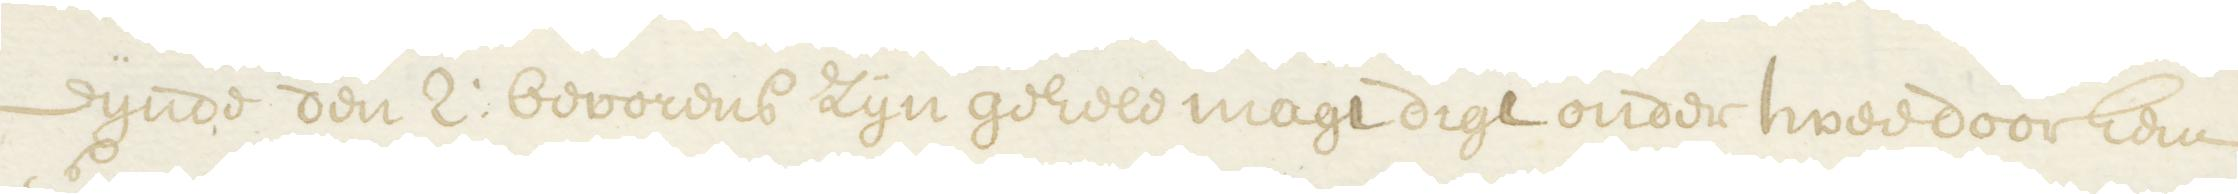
eijnde den 2: bevorens zijn gehele magt digt onder twee door hem
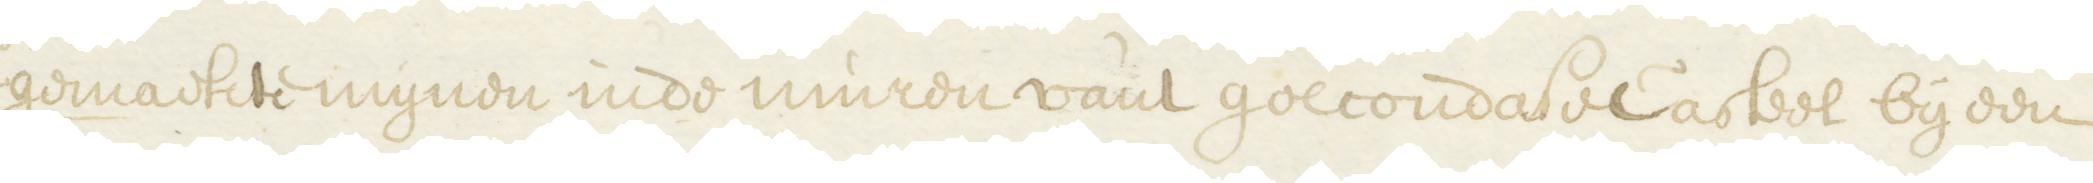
gemaekte mijnen inde muren van't golcondase Casteel bij een
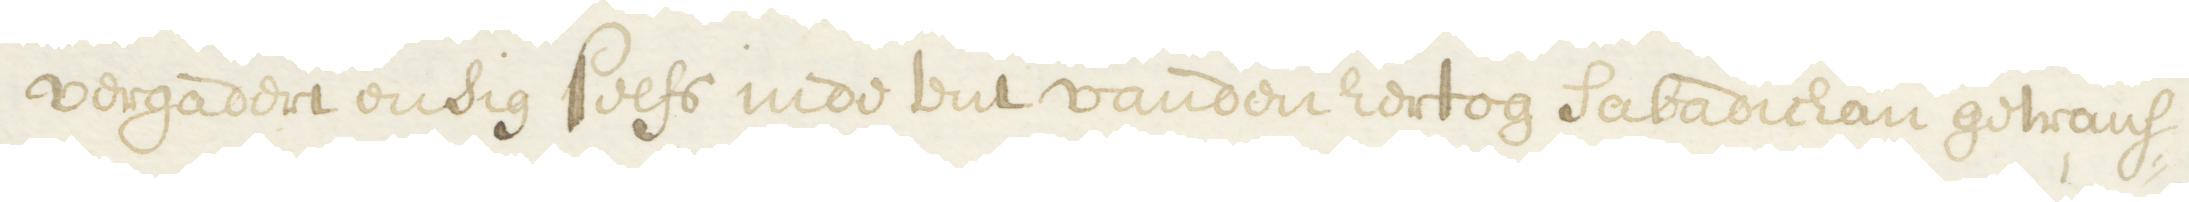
vergadert en sig selfs inde tent van den hertog Sabadichan getrans„
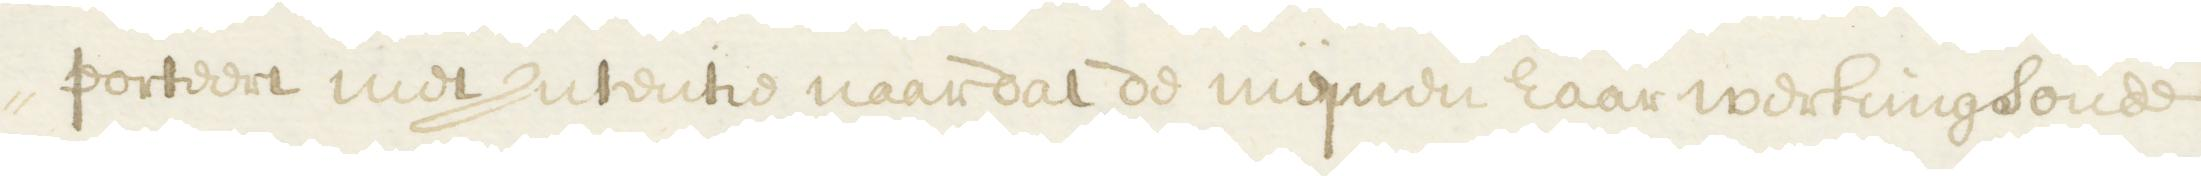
porteert met Jntentie naar dat de mijnen haar werking soude
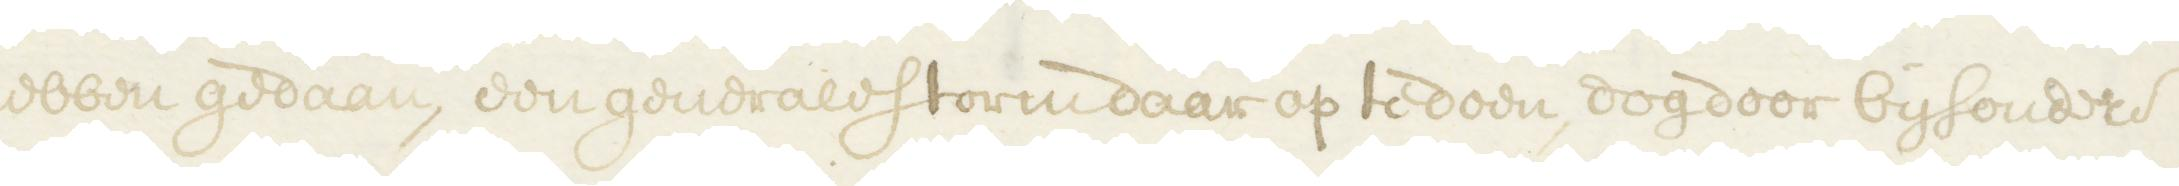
hebben gedaan, een generale storm daar op te doen, dog door bij sonders
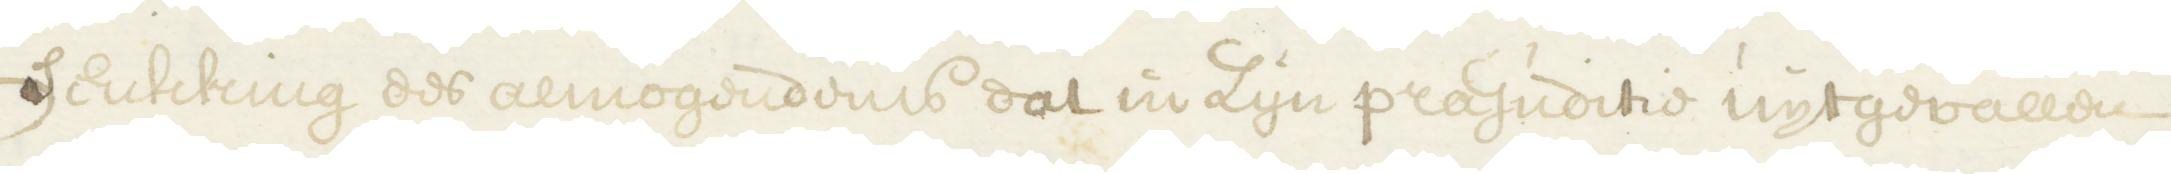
schikking des almogenden is dat in zijn prajuditie uijtgevallen
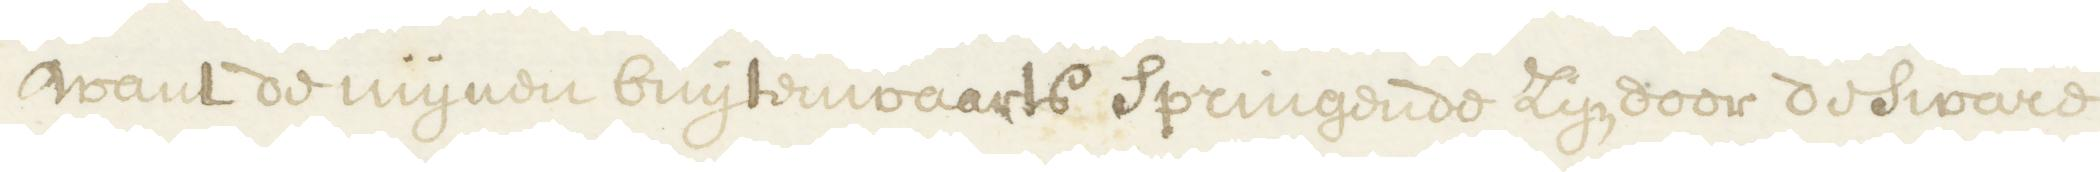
want de mijnen buijtenwaarts springende zijn door de sware
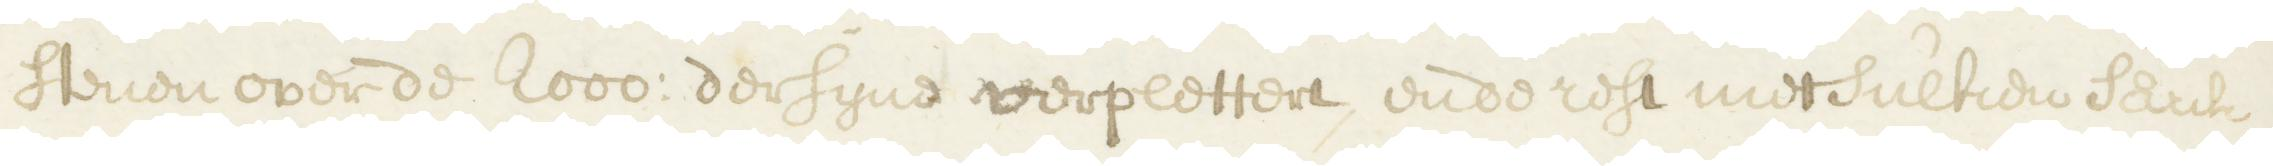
stenen over de 2000: dersijne verplettert, en de rest met sulken schrick
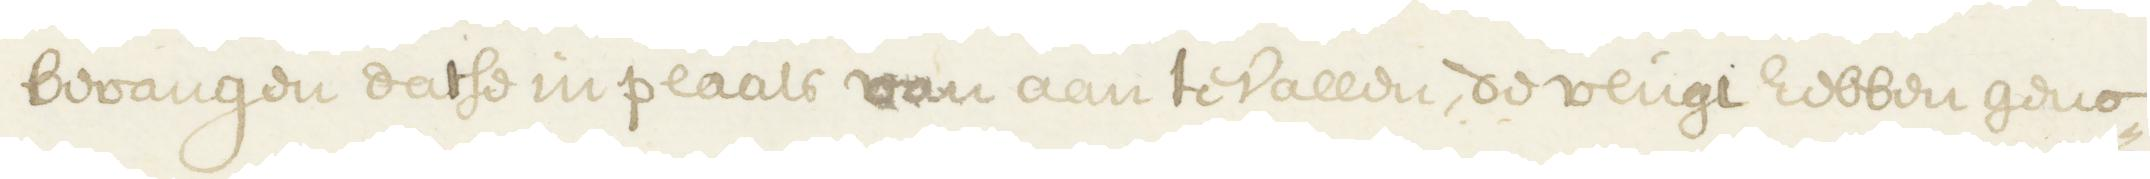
bevangen datse in plaats van aan te vallen, de vlugt hebben geno„
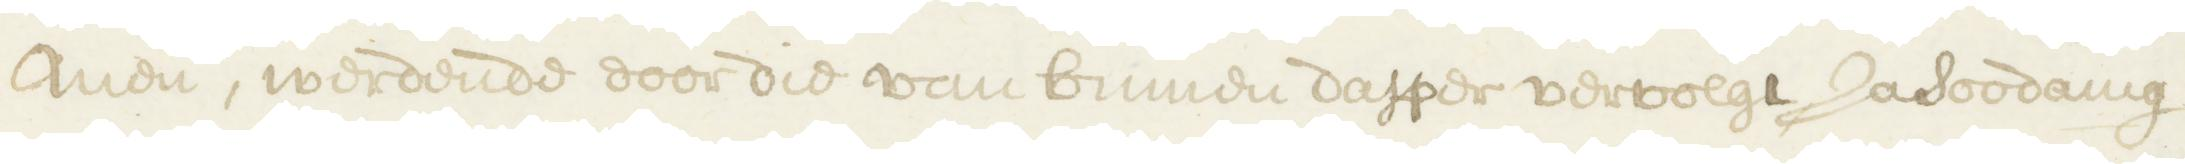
men, werdende door die van binnen dapper vervolgt, Ja soodanig
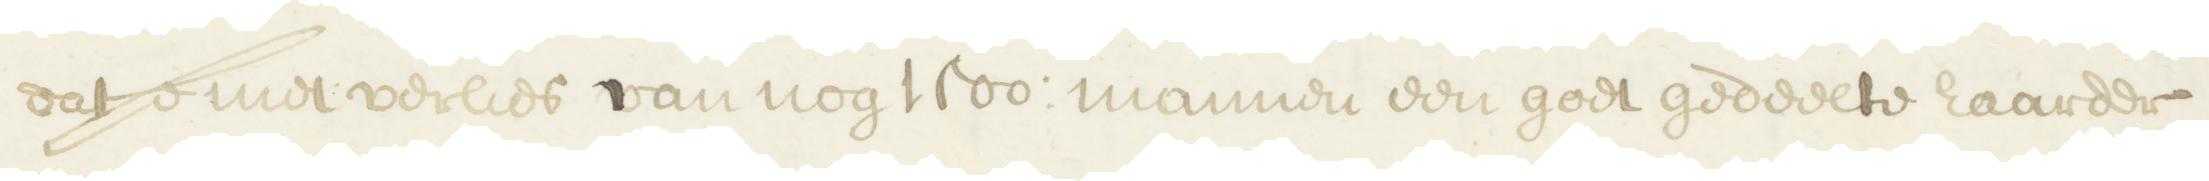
datse met verlies van nog 1500: mannen een goet gedeelte haarder
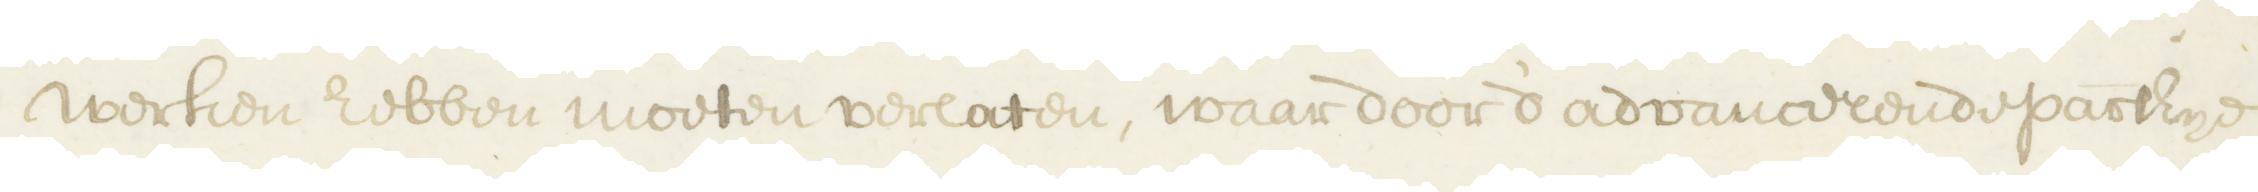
werken hebben moeten verlaten, waar door d’ advancerende parthije
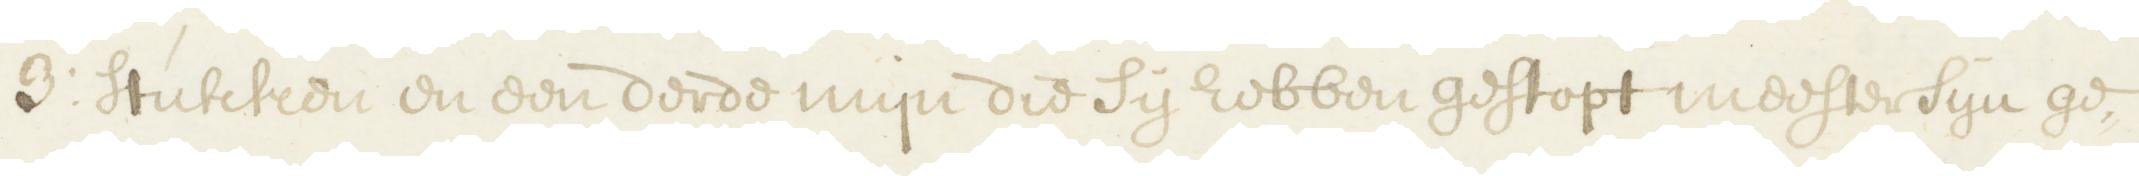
3: stukken en een derde mijn die sij hebben gestopt meester sijn ge„
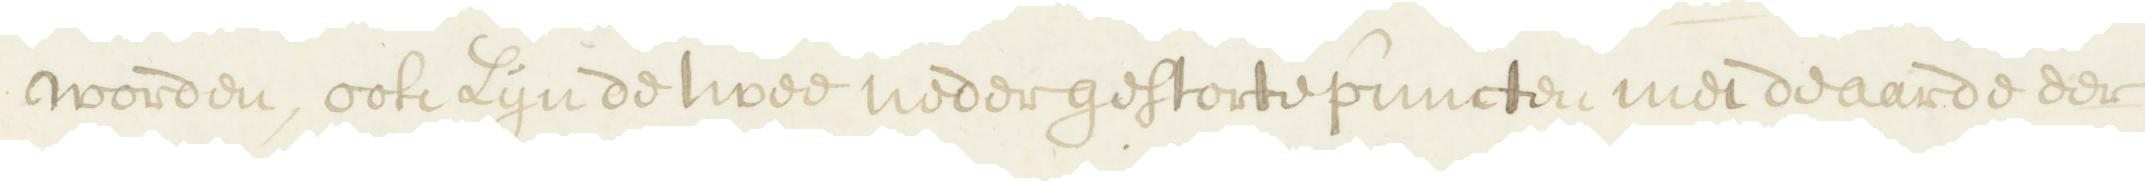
worden, ook zijn de twee neder gestorte puncten met de aarde der
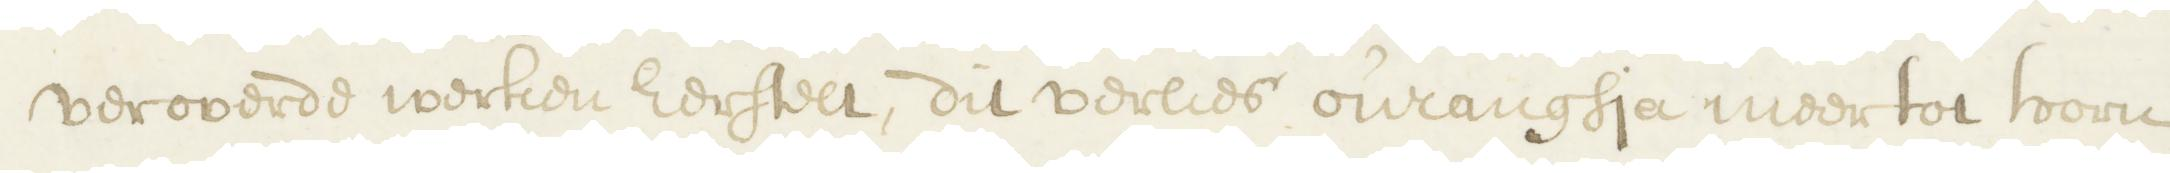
veroverde werken herstelt, dit verlies ourangsja meer tot horn
